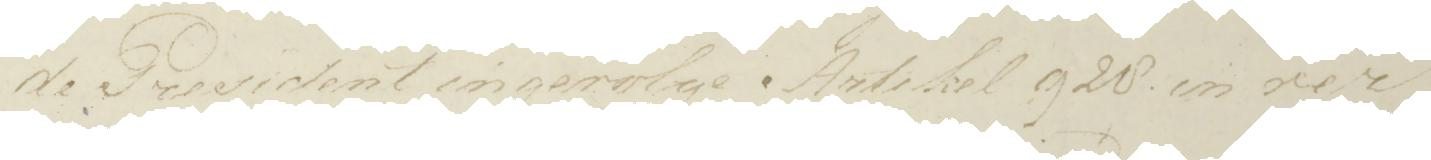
de President in gevolge Artikel 928. in ver
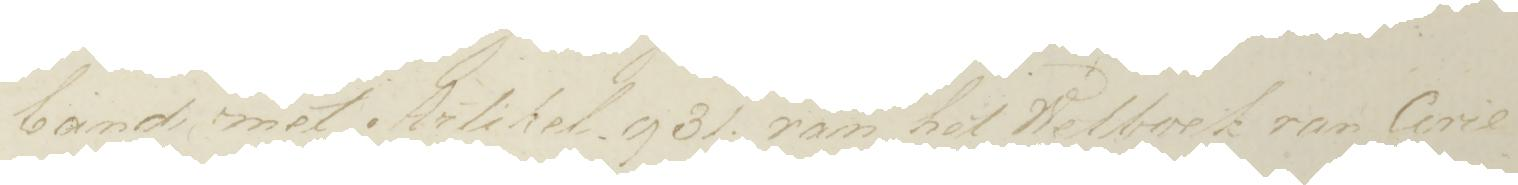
band met Artikel 931. van het Wetboek van Civie
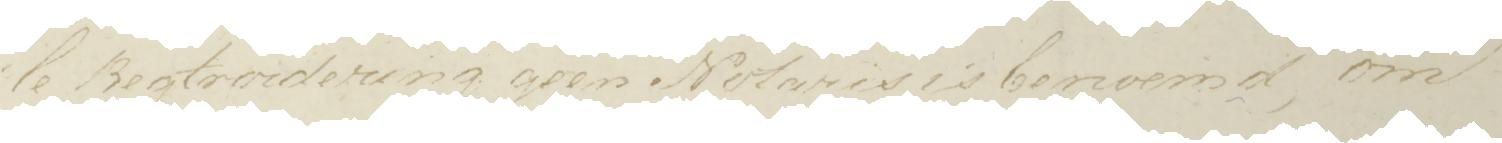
le Regtvordering geen Notaris is benoemd om
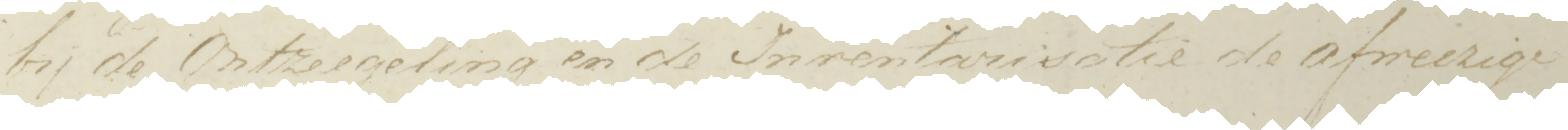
bij de Ontzeegeling en de Jnventarisatie de afweezige
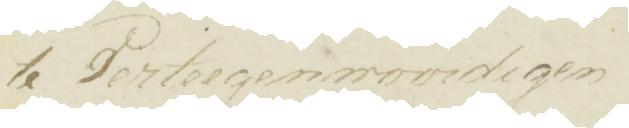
te Verteegenwoordigen
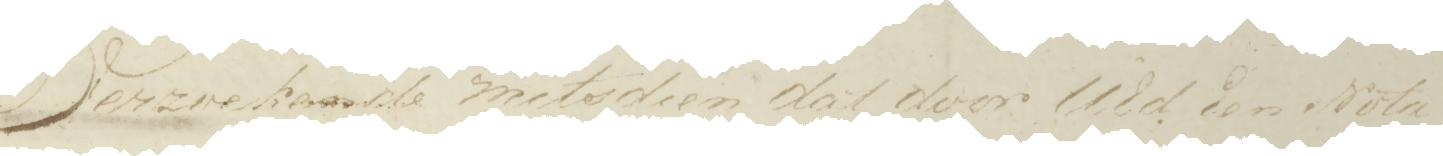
Verzoekende mitsdien dat door UEd. Een Nota
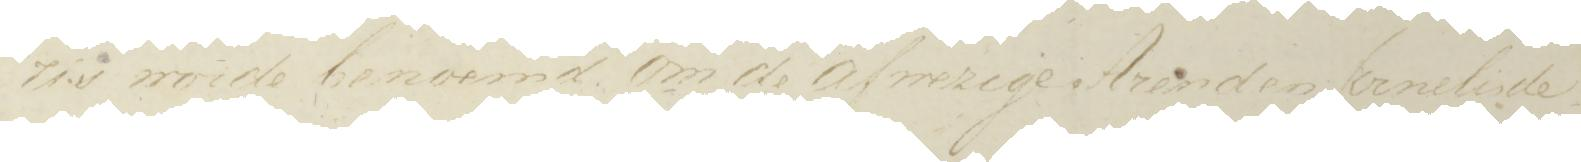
ris worde benoemde om de afwezige Arend en Cornelis de
